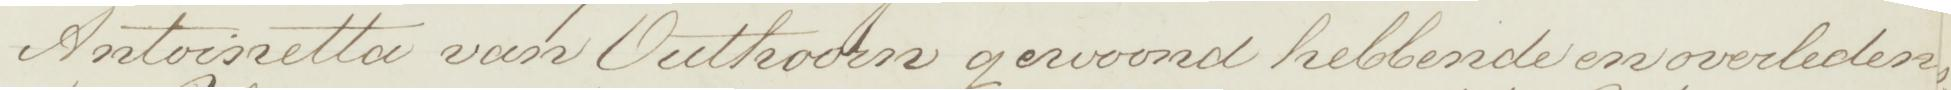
Antoinetta van Outhoorn gewoond hebbende en overleden,
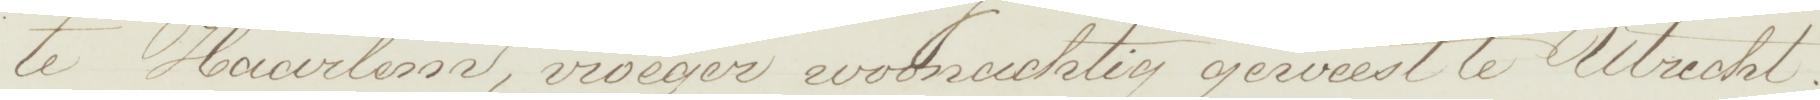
te Haarlem, vroeger woonachtig geweest te Utrecht.
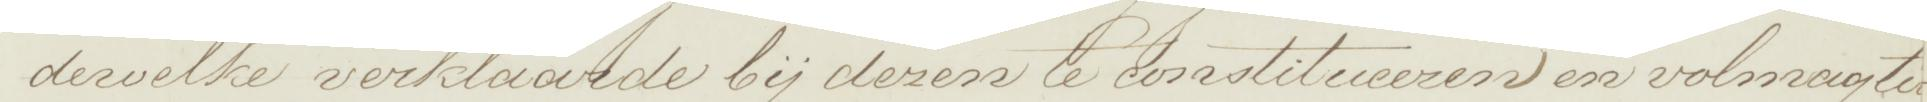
dewelke verklaarde bij dezen te constitueeren en volmagti
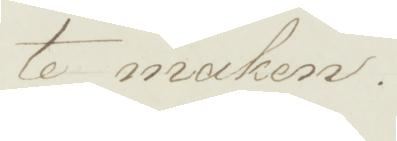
te maken.
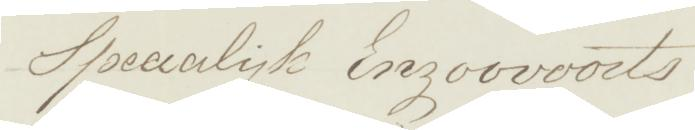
Specialijk Enzoovoorts
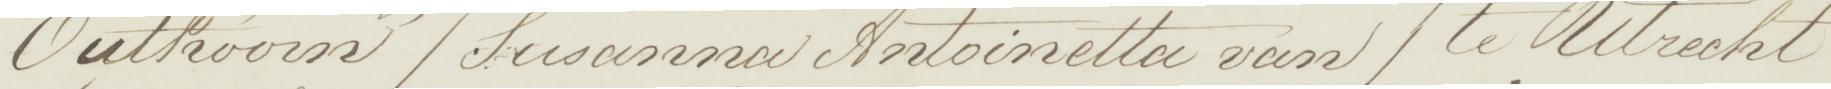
Outhoorn / Susanna Antoinetta van / te Utrecht
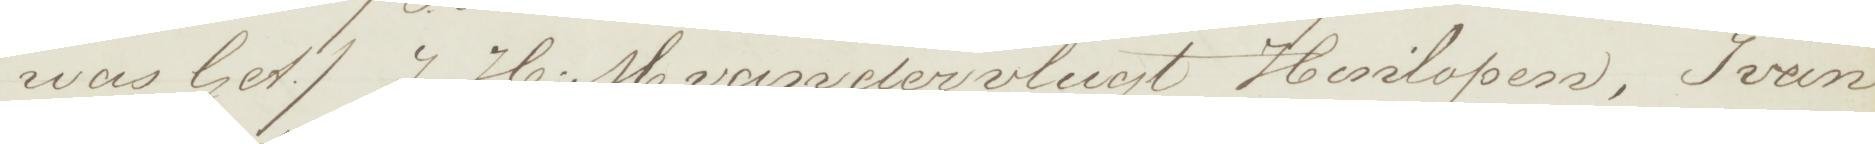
/ was Get:/ J H: M van der vlugt Hinlopen, I van
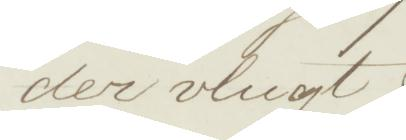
der vlugt, P J P Mosselmans Hinlopen, B:C:J Mossel„
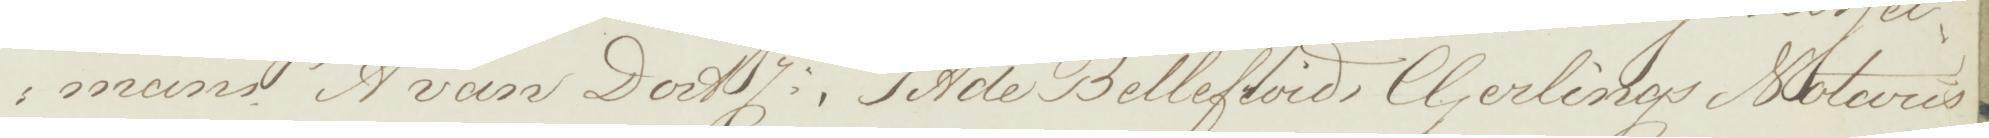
„mans, A van Dort J:r, I A de Bellefroid, C Gerlings Notaris
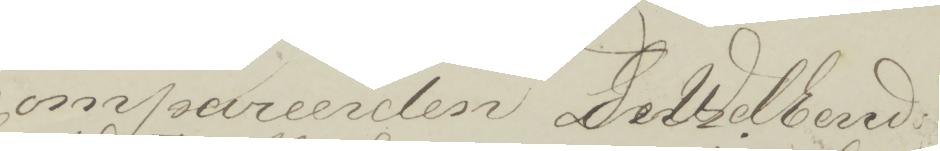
Compareerden de WelEerd:
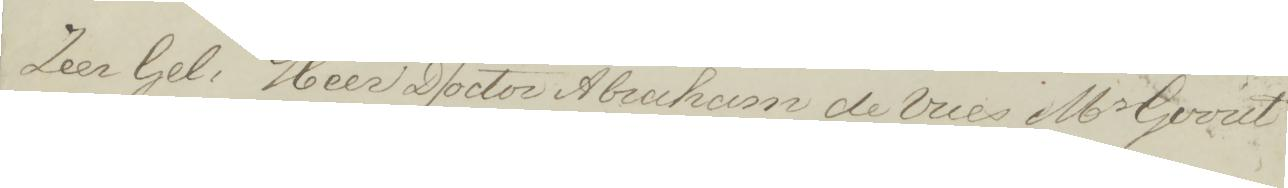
Zeer Gel: Heer Doctor Abraham de Vries, Mr Gerrit
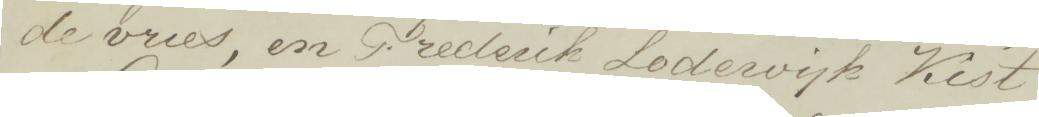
de vries, en Frederik Lodewijk Kist
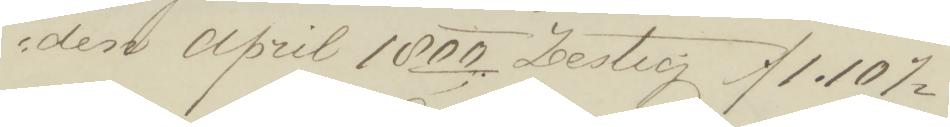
„den April 1800 Zestig ƒ1.10½
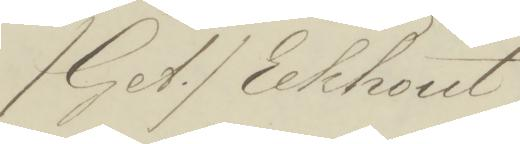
/ Get:/ Eekhout
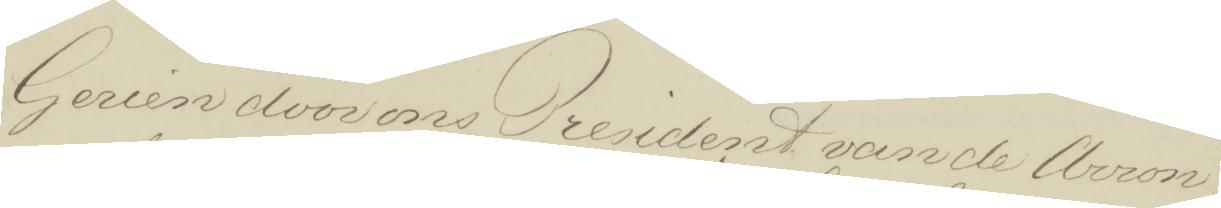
Gezien door ons President van de Arron
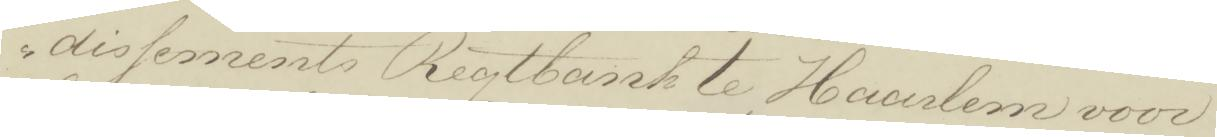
„dissements Regtbank te Haarlem voor
